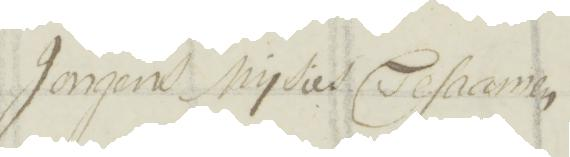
Jongens Mijsies Tesaamen
